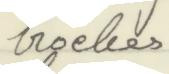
broches
